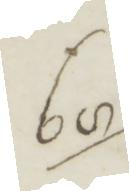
68
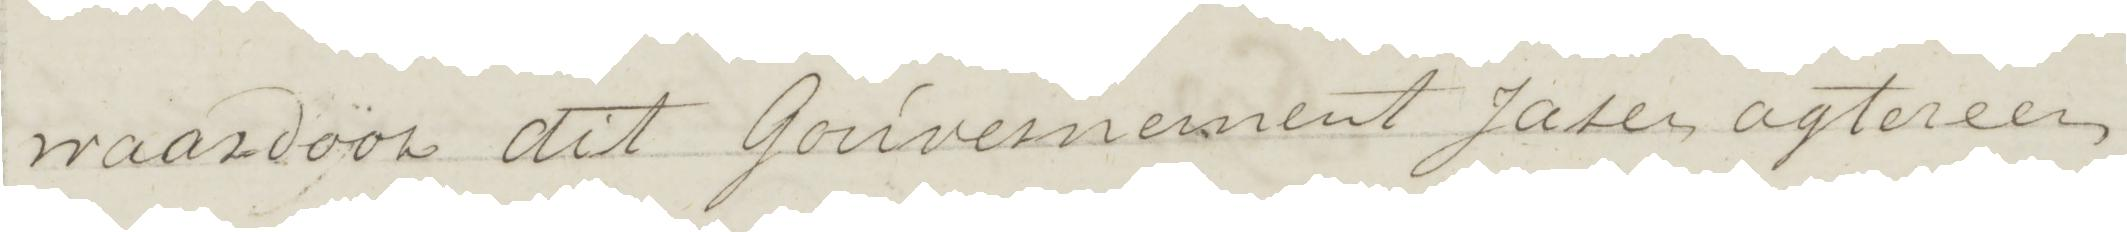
waardoor dit Gouvernement jaren agtereen
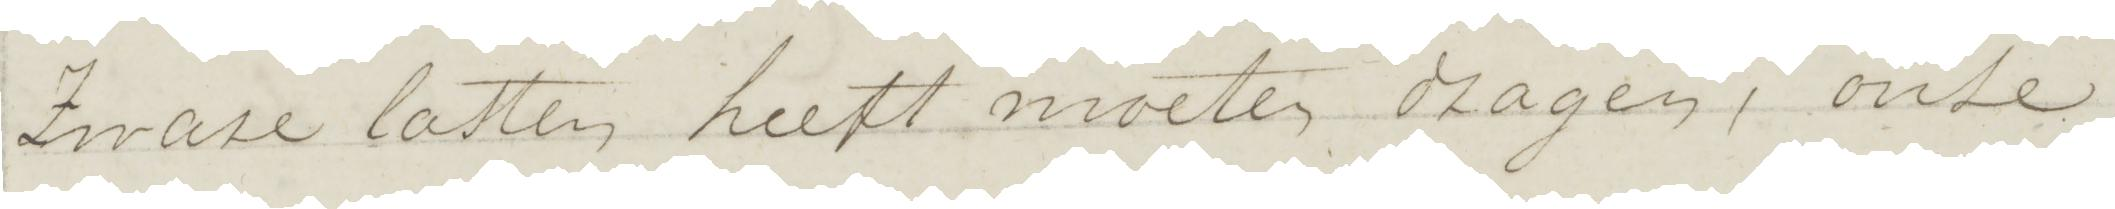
zware lasten heeft moeten dragen, onse
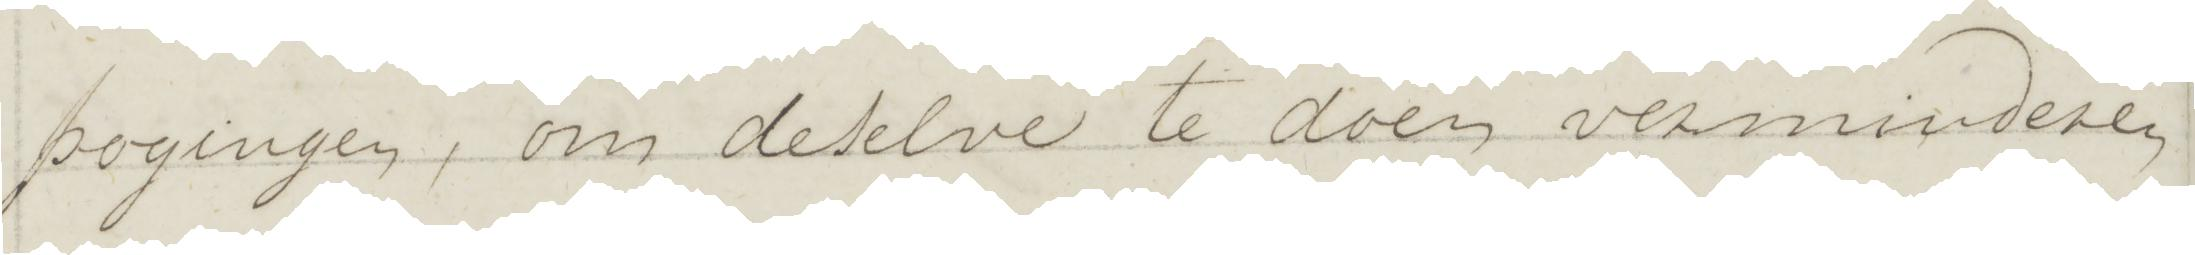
pogingen, om deselve te doen verminderen
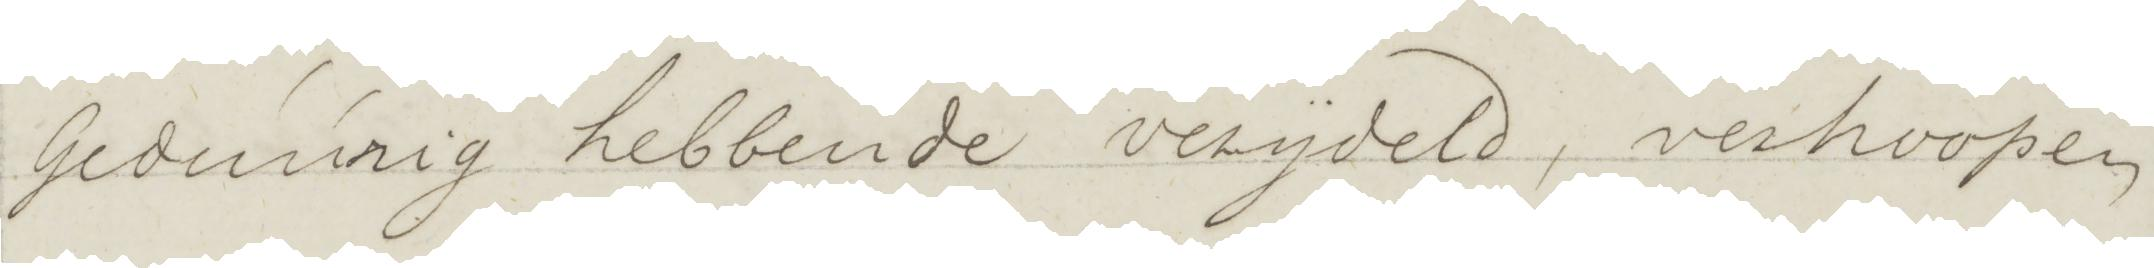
Geduurig hebbende verijdeld, verhoopen
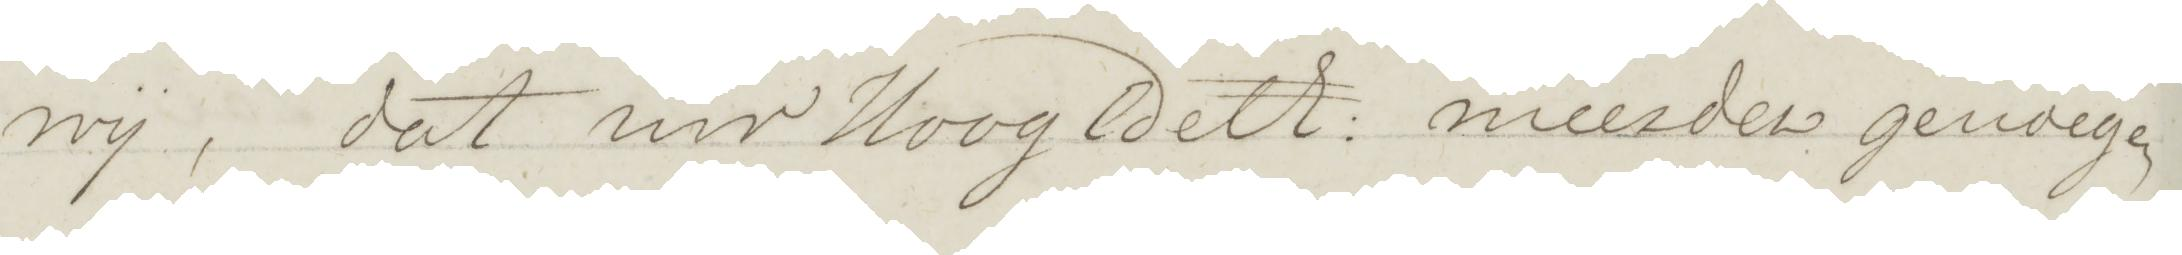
wij, dat uw Hoog Edelh: meerder genoegen
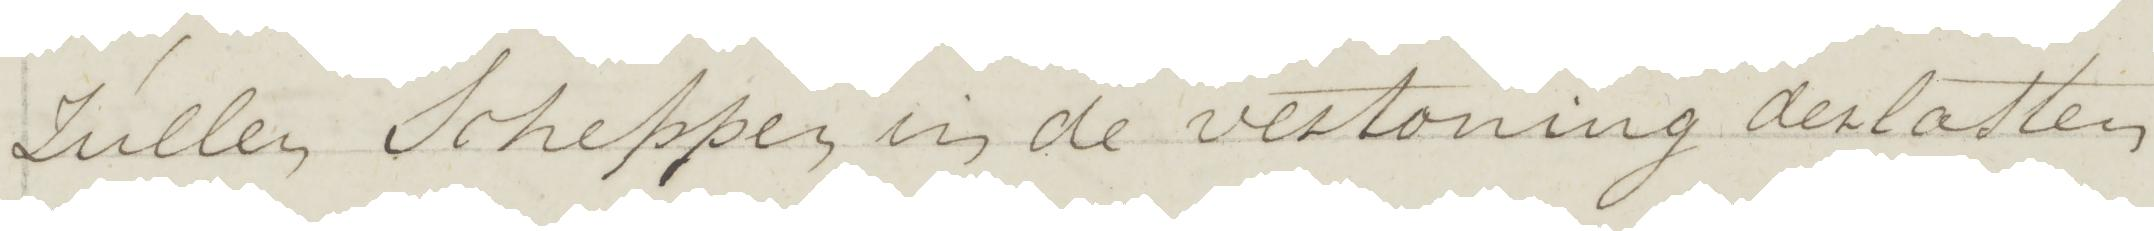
zullen scheppen in de vertoning der lasten
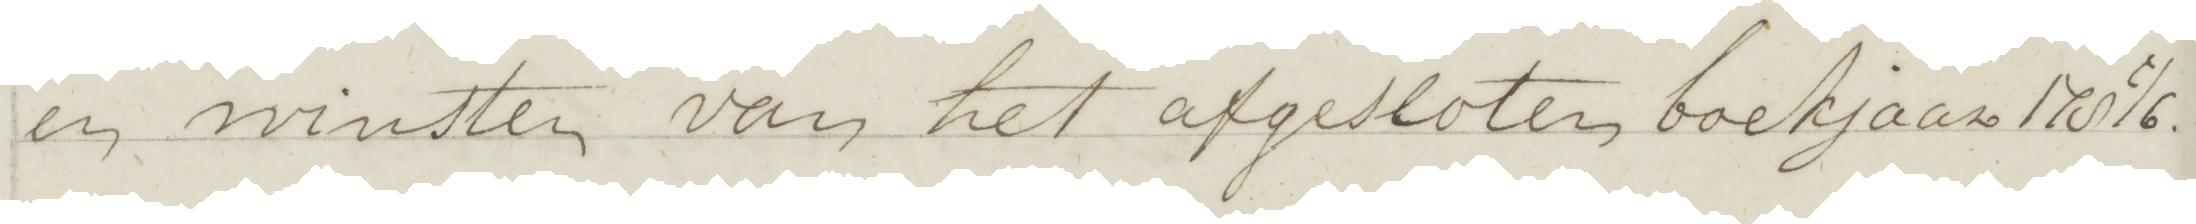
en winsten van het afgesloten boekjaar 1785/6.
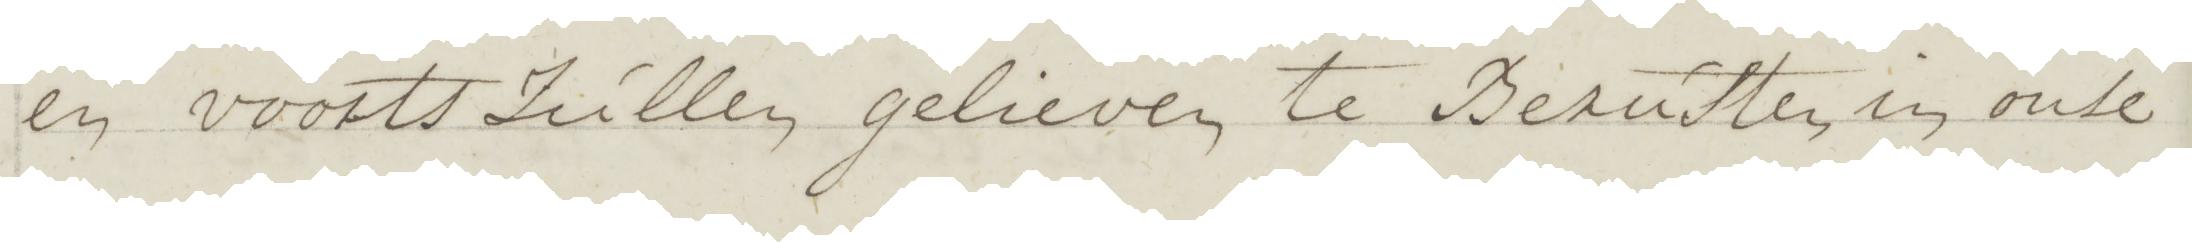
en voorts zullen gelieven te Berusten in onse
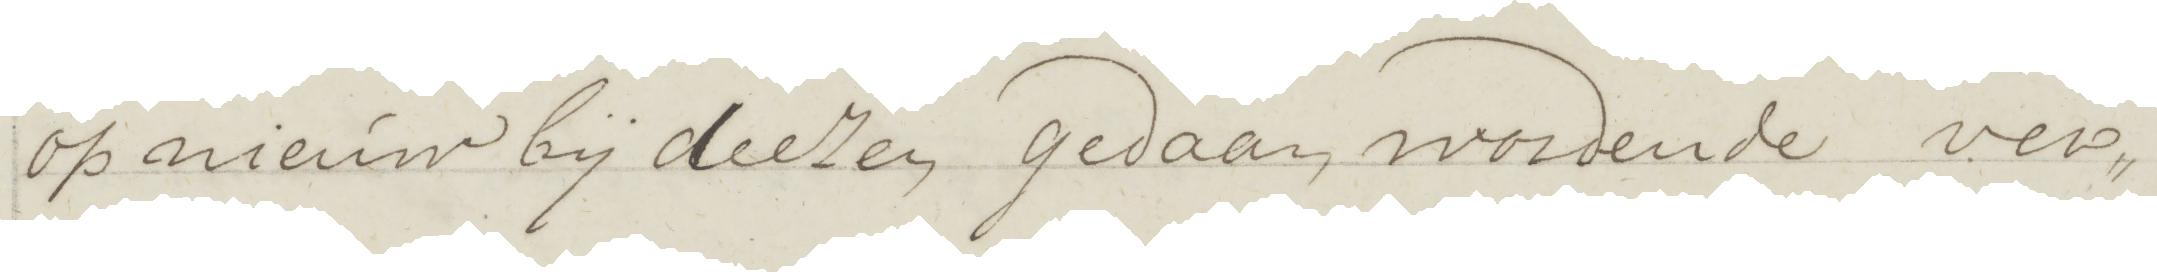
op nieuw bij deezen gedaan wordende ver„
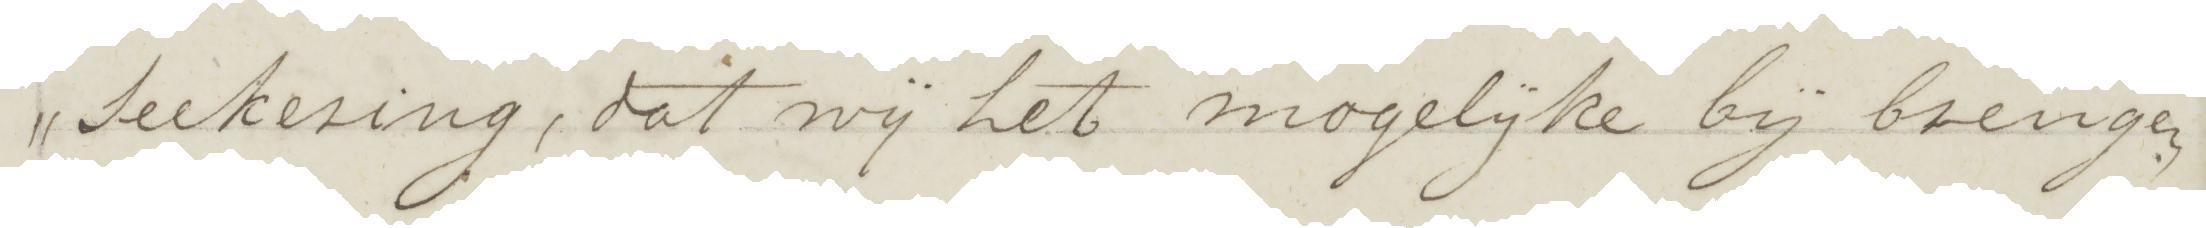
„seekering, dat wij het mogelijke bij brengen
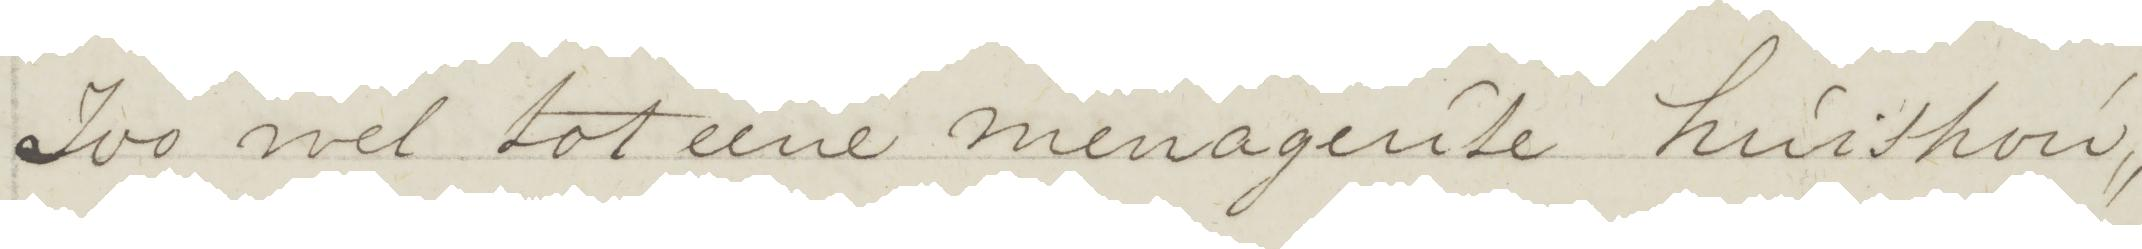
zoo wel tot eene menageuse huishou„
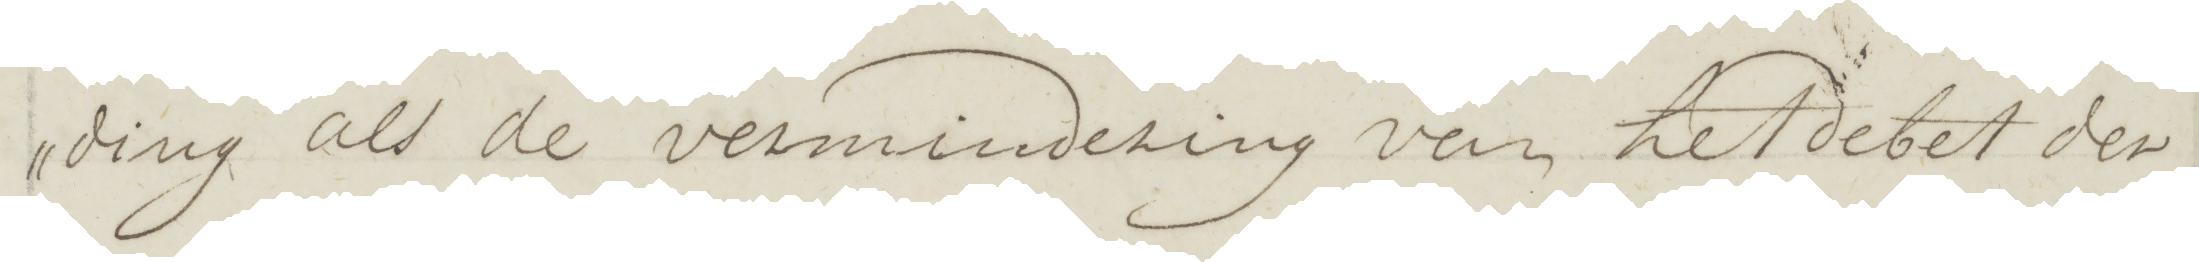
„ding als de vermindering van het debet der
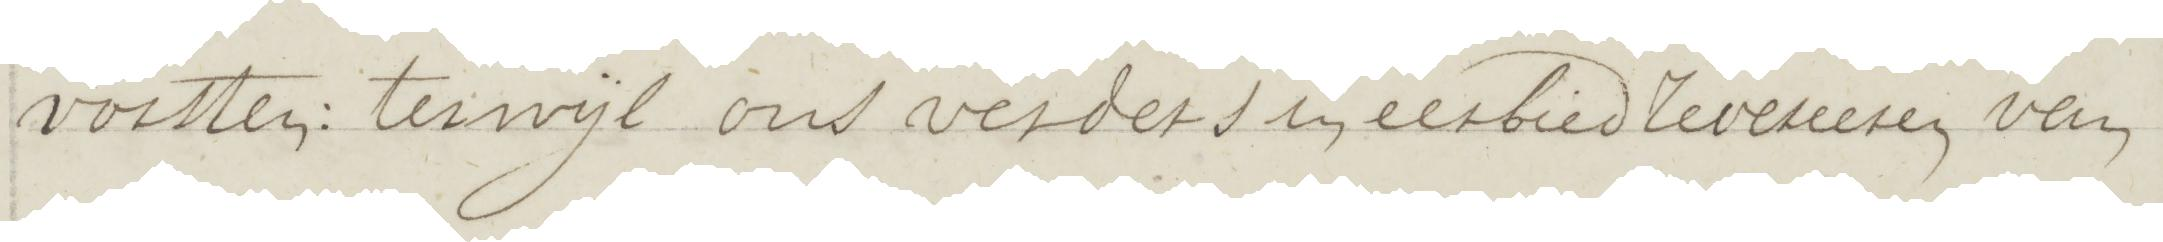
vorsten: terwijl ons verders in eerbied revereeren van
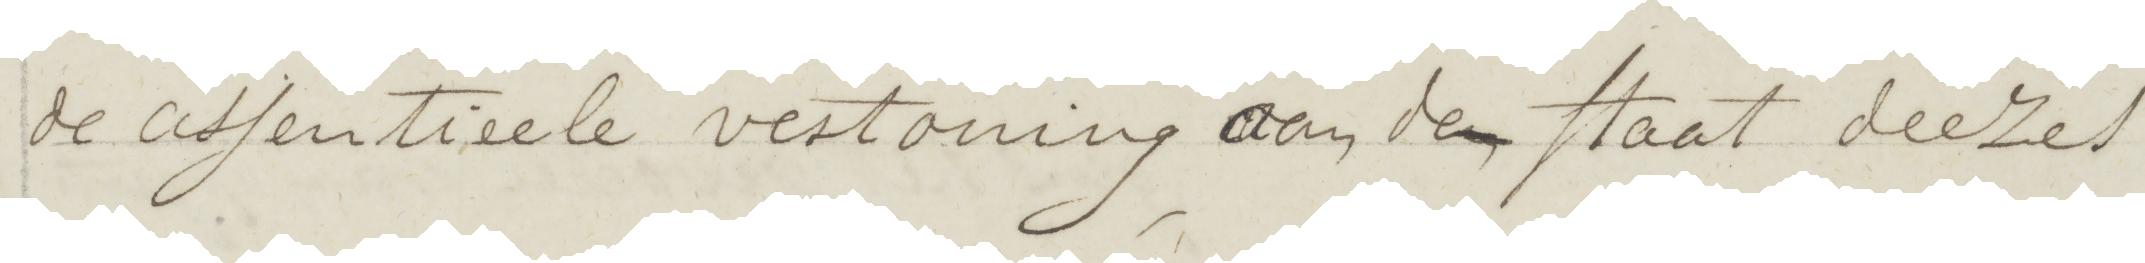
de assentieele vertoning aan den staat deezes
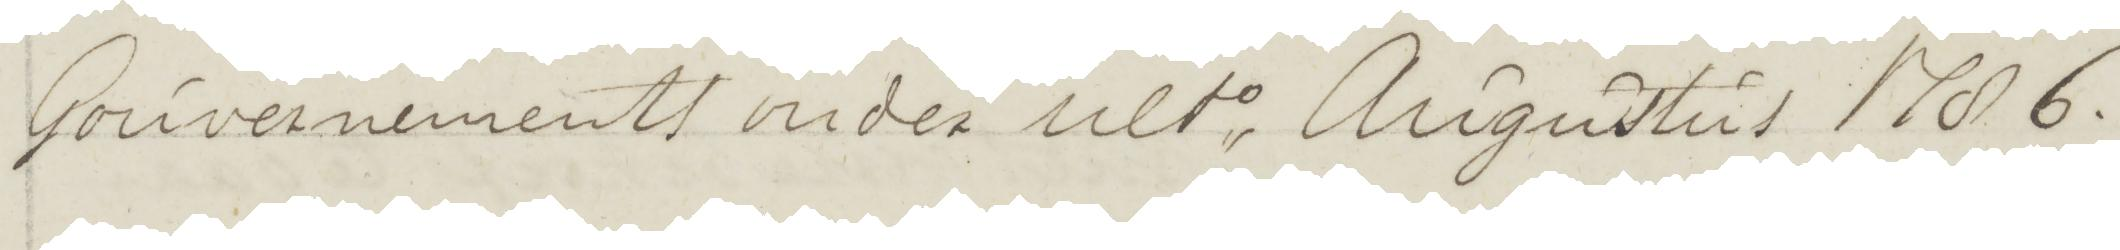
Gouvernements onder ult„o Augustus 1786.
